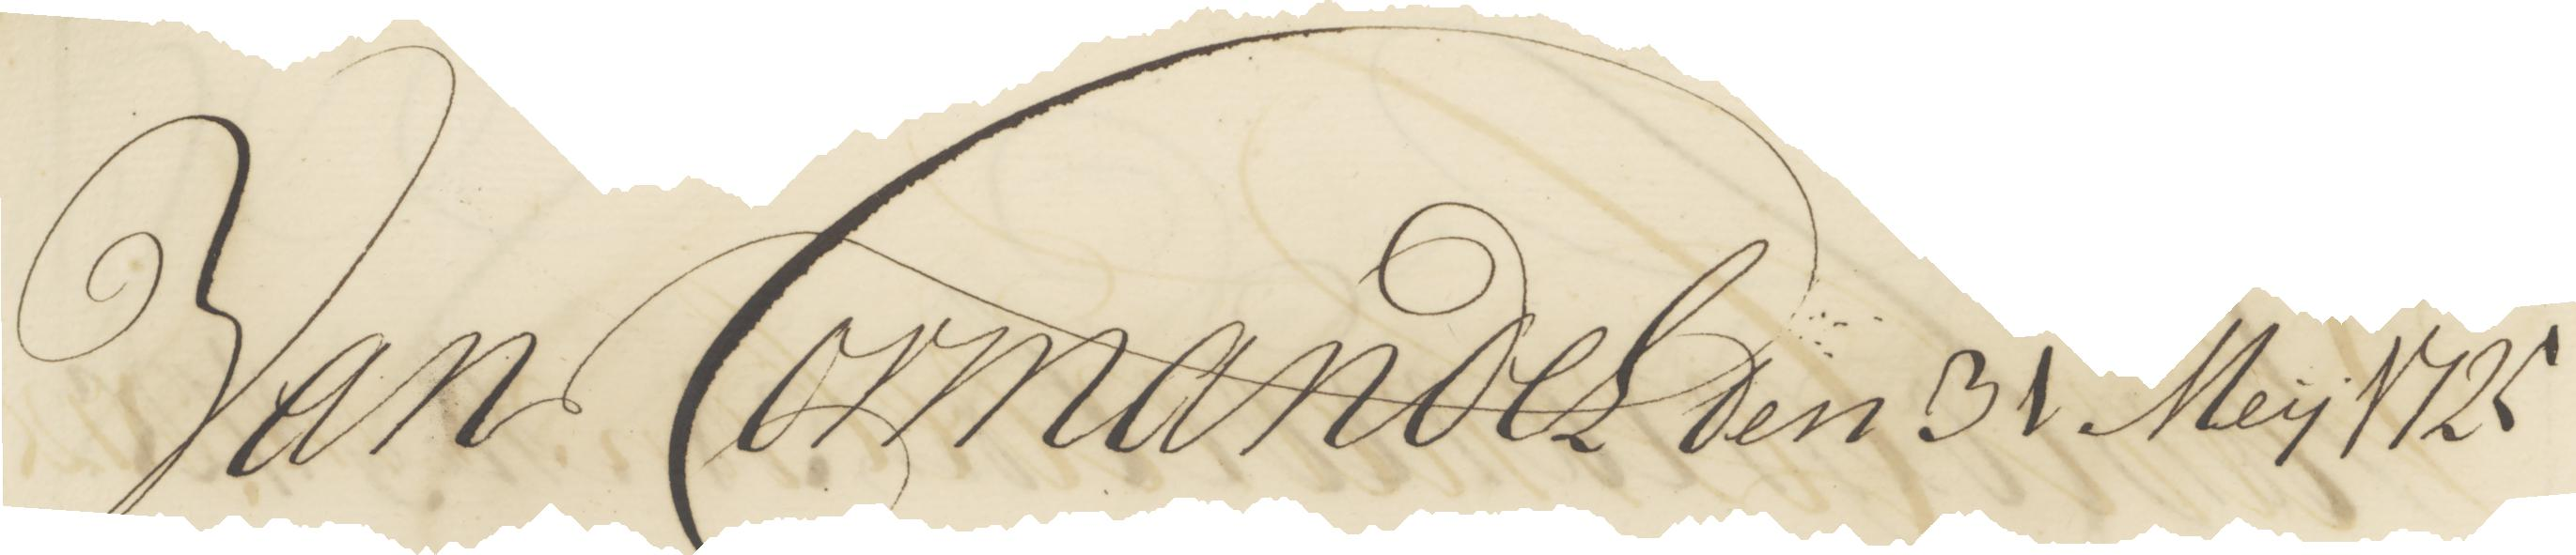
Van Cormandel den 31 Meij 1725
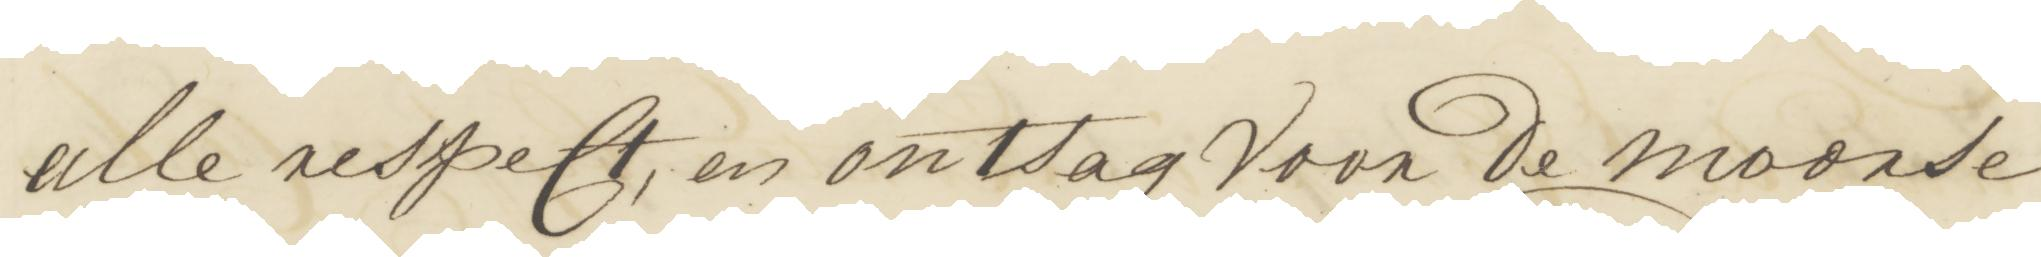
alle respect, en ontsag voor de moorse
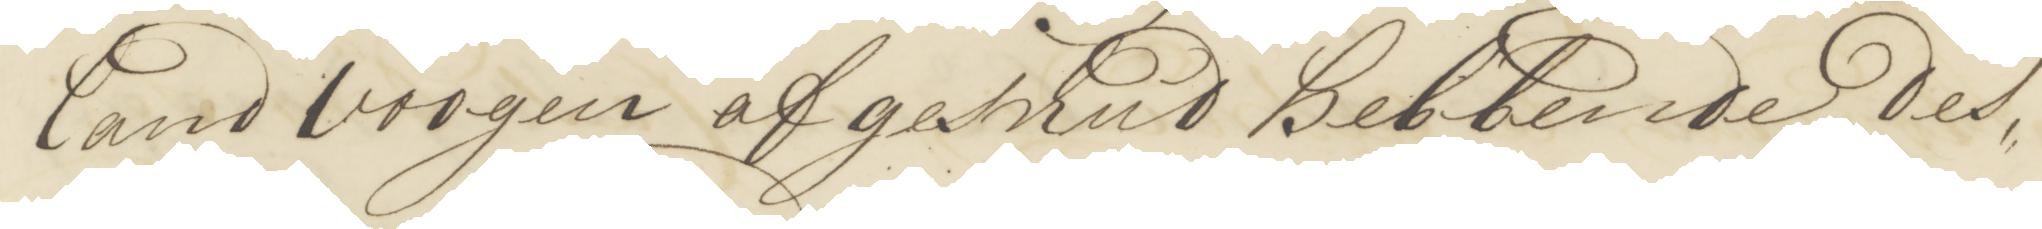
land voogen af geschud hebbende des„
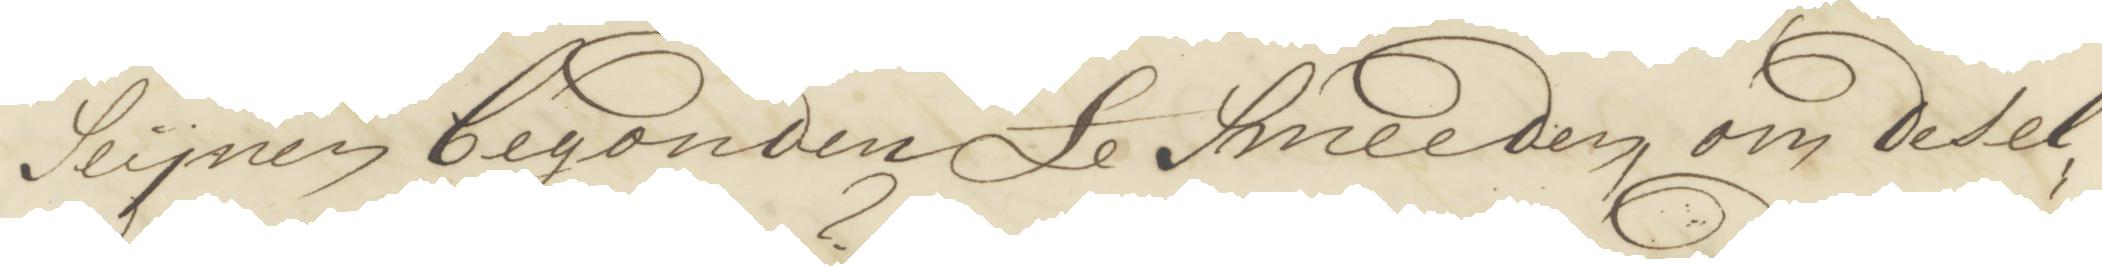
seijnen begonden te smeeden, om desel„
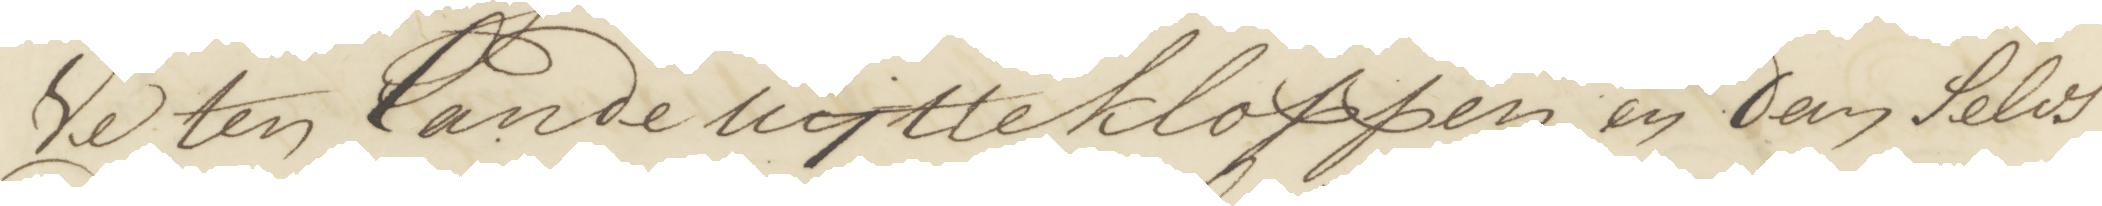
ve ten lande uijttekloppen, en dan selvs
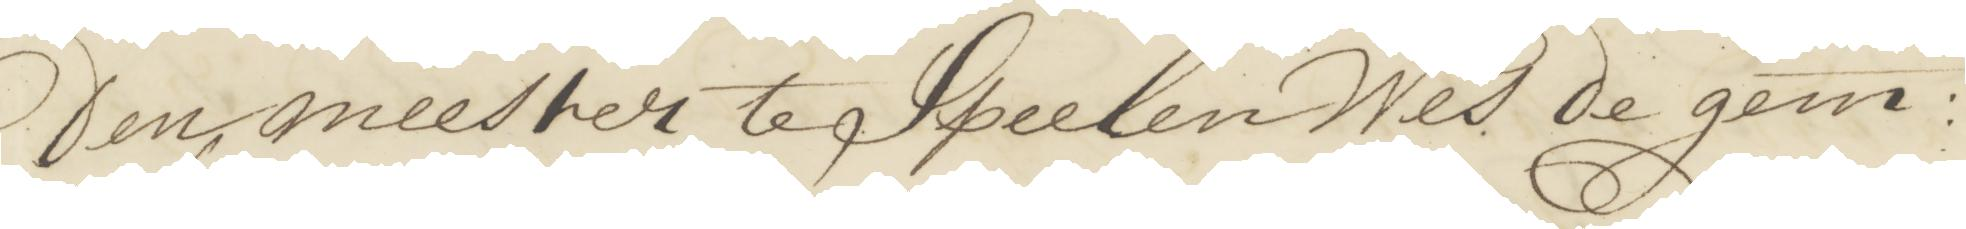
den meester te speelen Wes de gem:
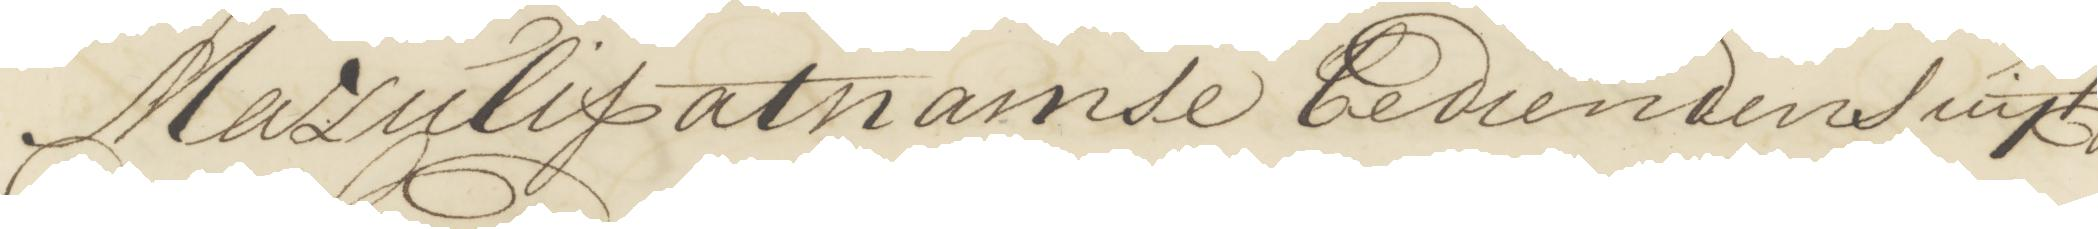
Mazulipatnamse bediendens uijt
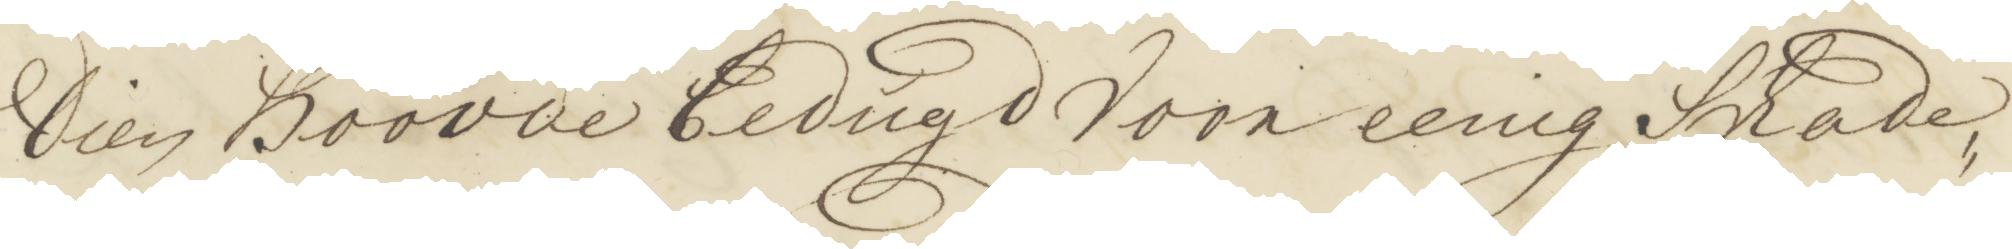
dien hoovde bedugd voor eenig schade„
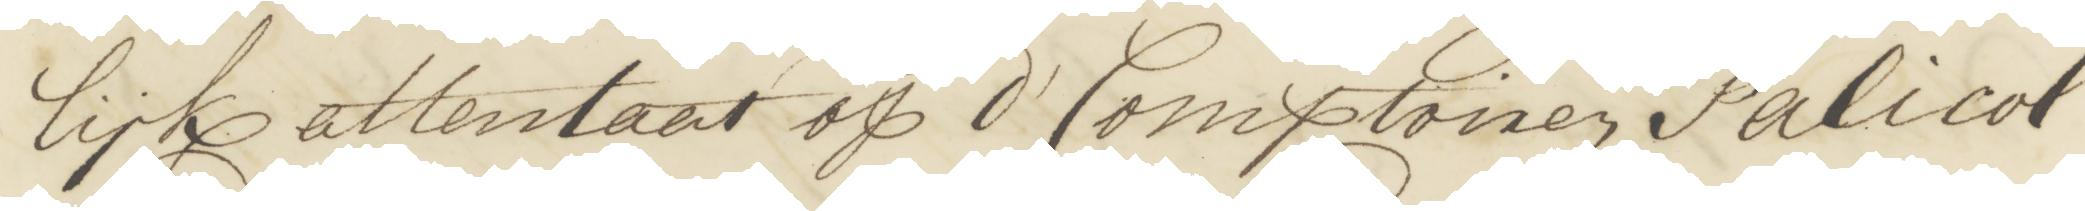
lijk attentaat op d’ Comptoiren Palicol
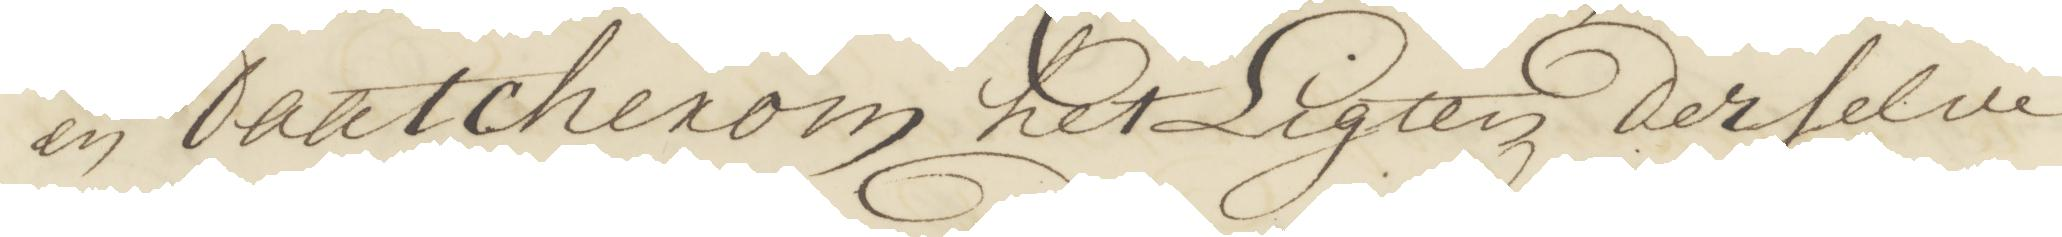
en daatcherom het Ligten derselve
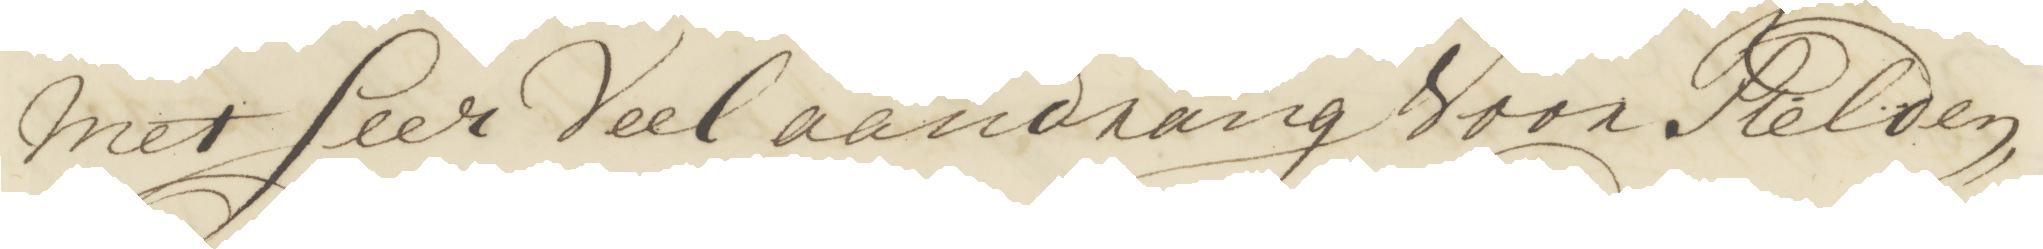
met seer veel aandrang voor stelden,
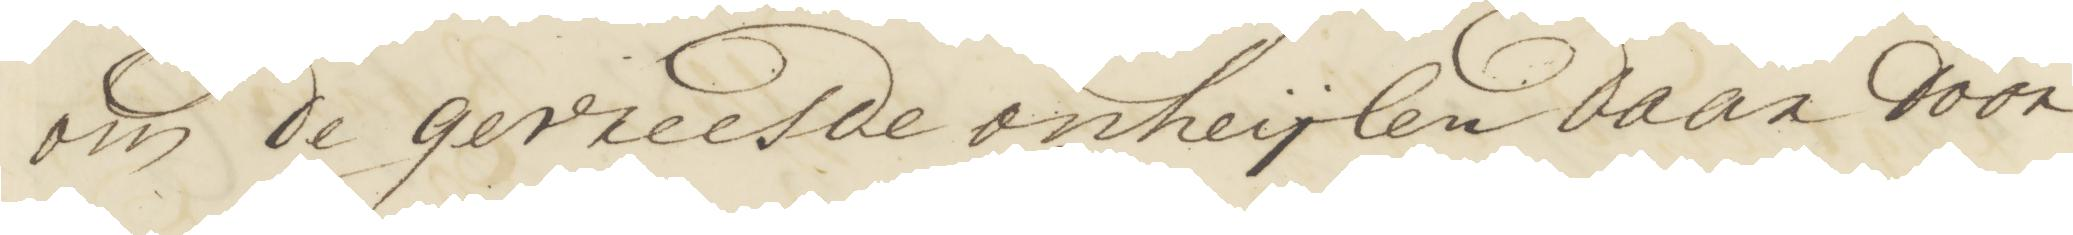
om de gevreesde onheijlen daar door
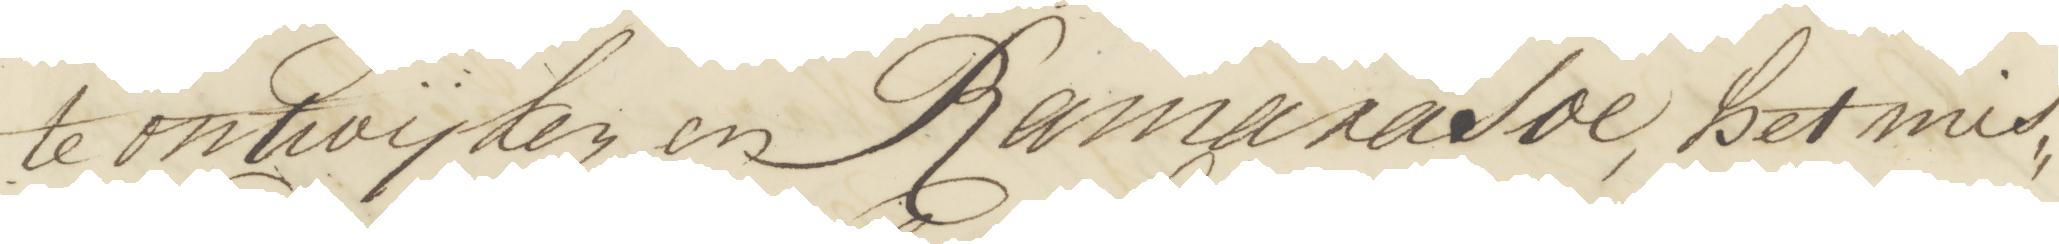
te ontwijken en Ramarasoe, het mis„
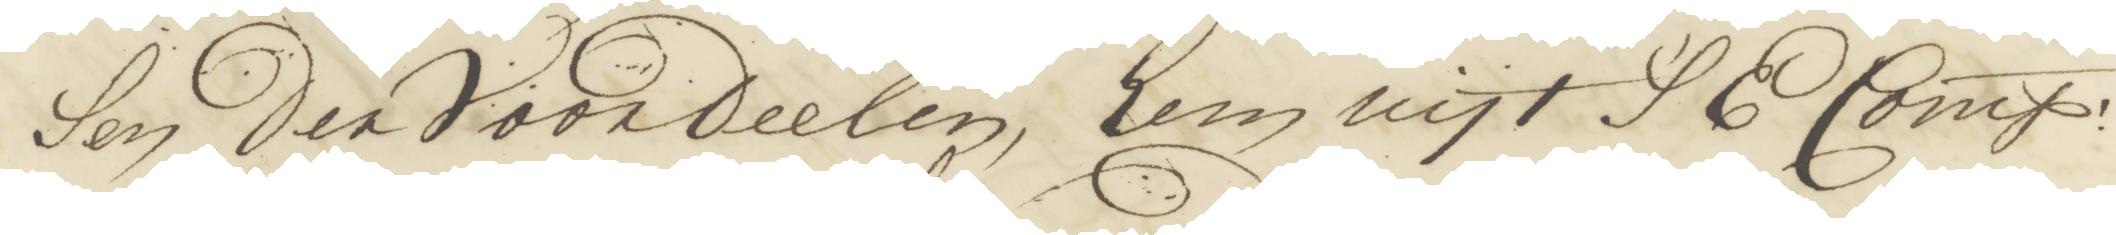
sen der Voordeelen, hem uijt ’s E Comp
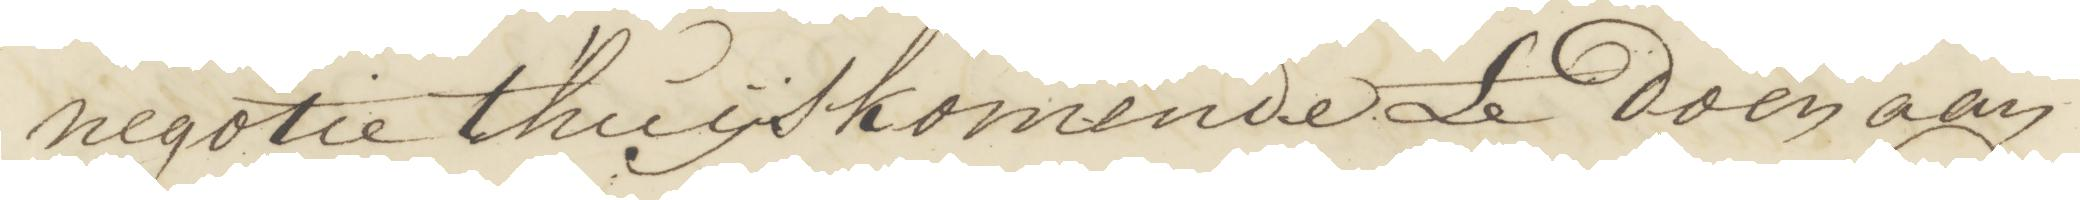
negotie thuijs komende te doen aan
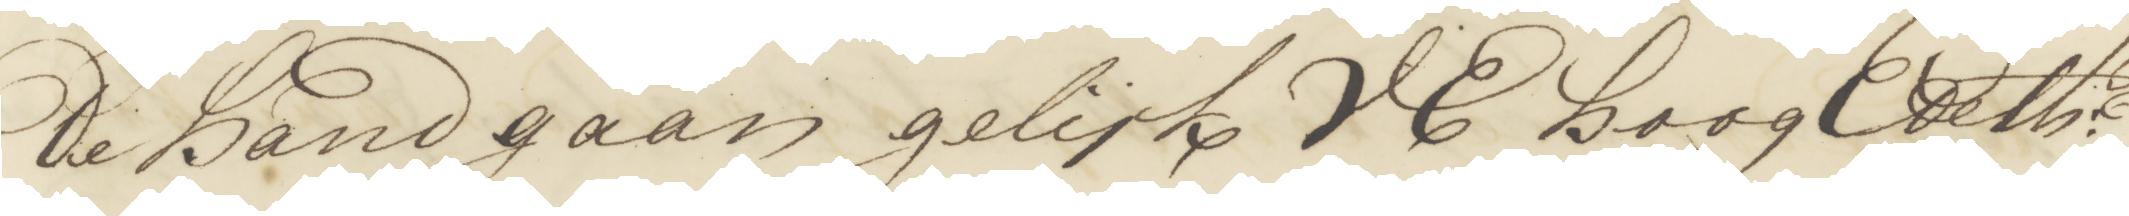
de hand gaan gelijk VE hoog Edelh:s
